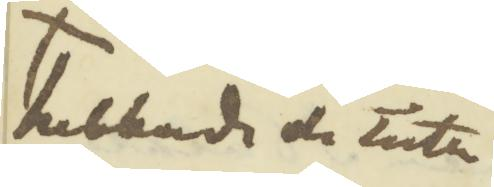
¶ hebbende de testa
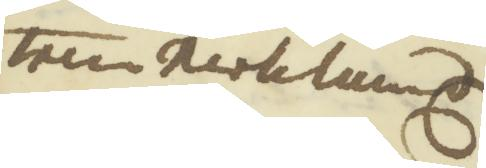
trice verklaard
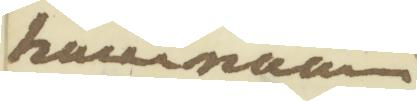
haren naam
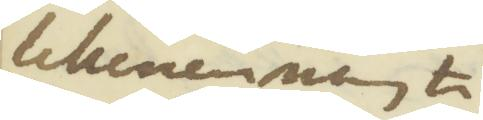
tekenen niet
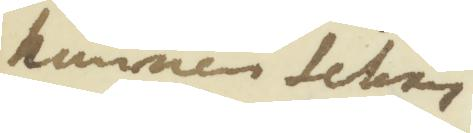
kunnen schry
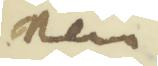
ven
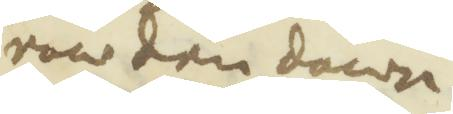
voor drie doorge
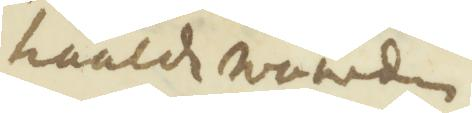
haalde woorden
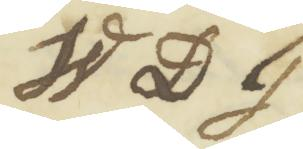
W D G
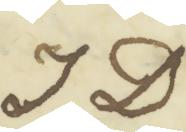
J D
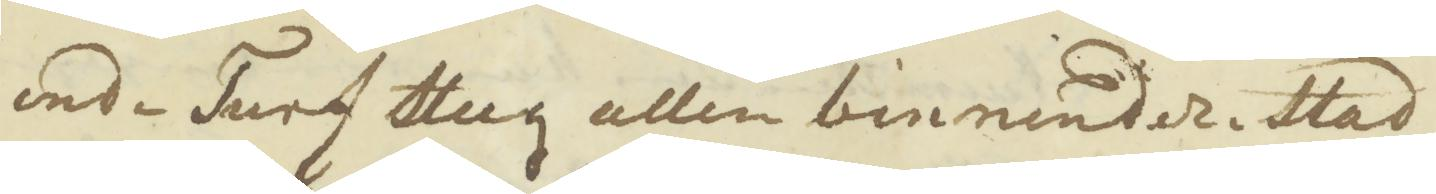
inde Turf steeg allen binnen deze stad
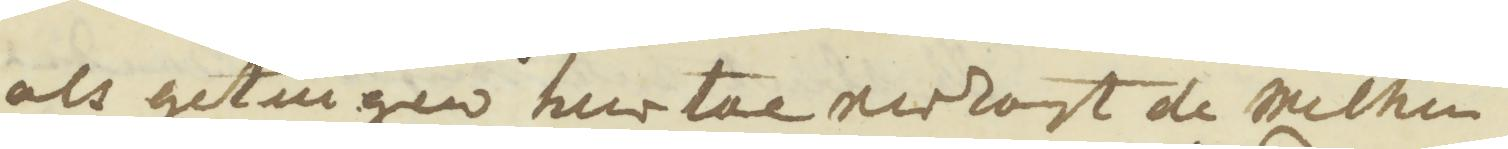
als getuigen hier toe verzogt de welken
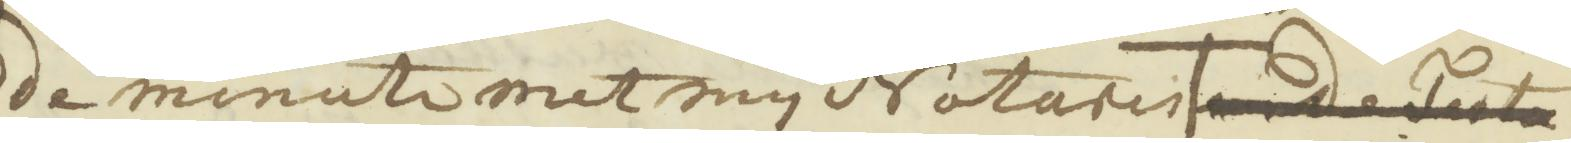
de minute met mij Notaris ¶ en de Testa
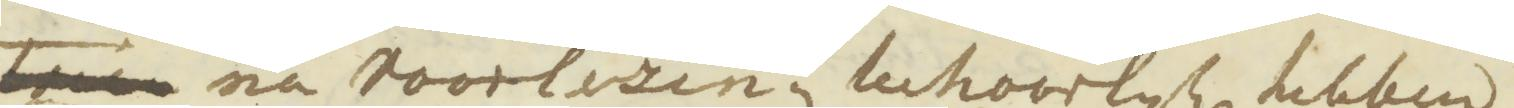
trice na voorlezing behoorlyk hebben
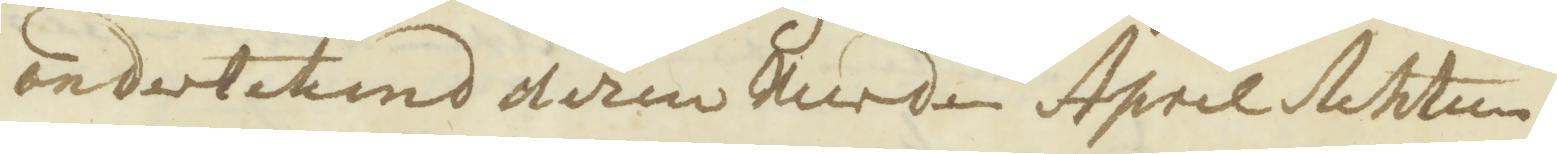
ondertekend dezen Vierden April Achtien
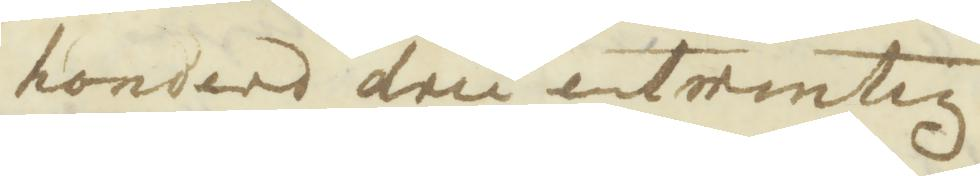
honderd drie entwintig
